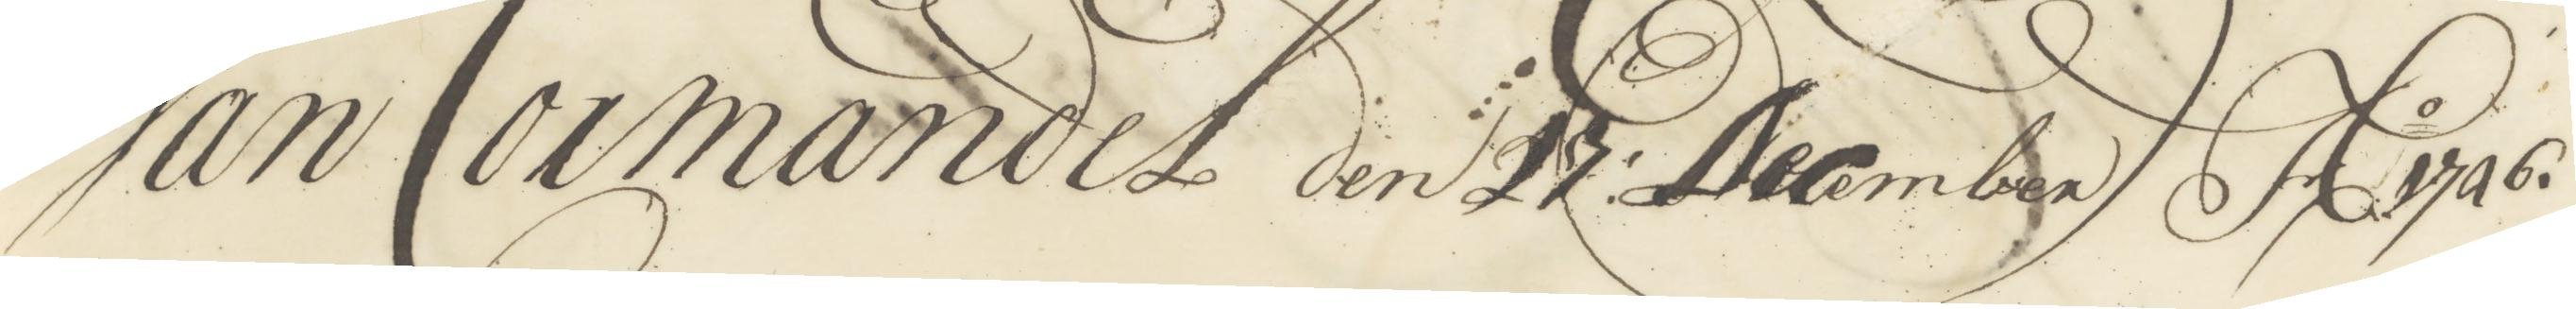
Van Cormandel den 27:' December A=o 1746.
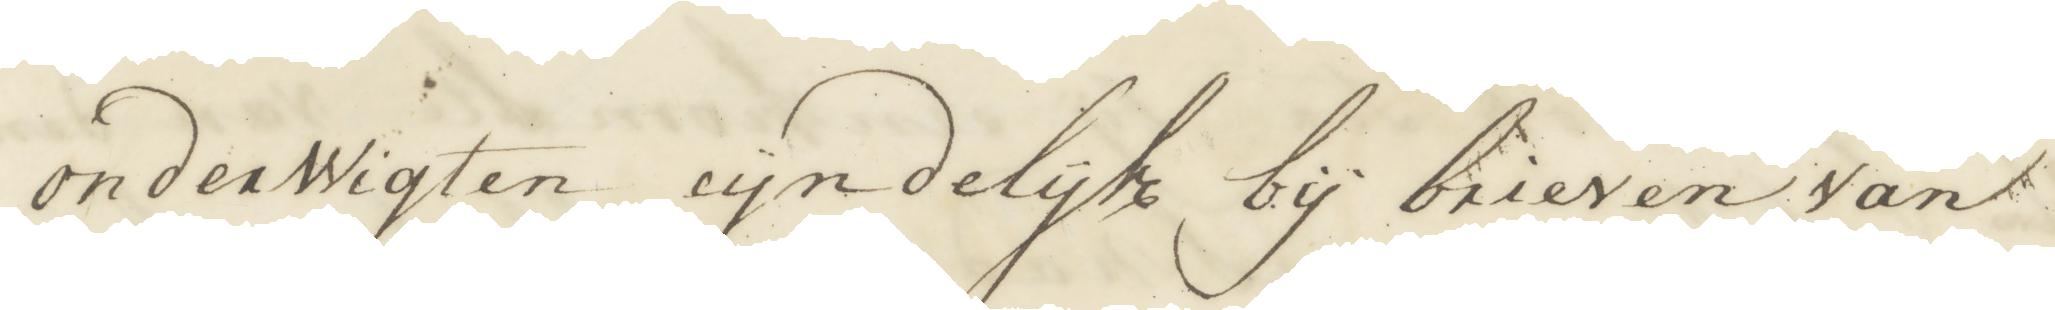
onderwigten eijndelijk bij brieven van
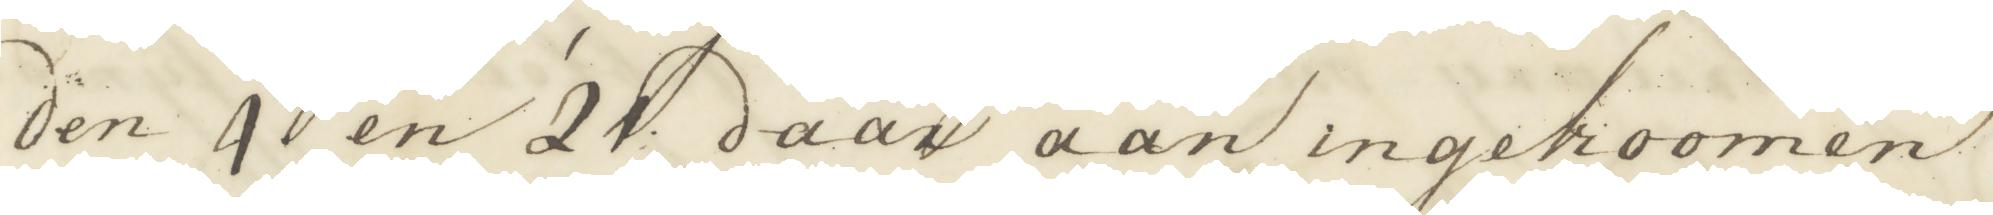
den 4' en 21: daar aan ingekoomen
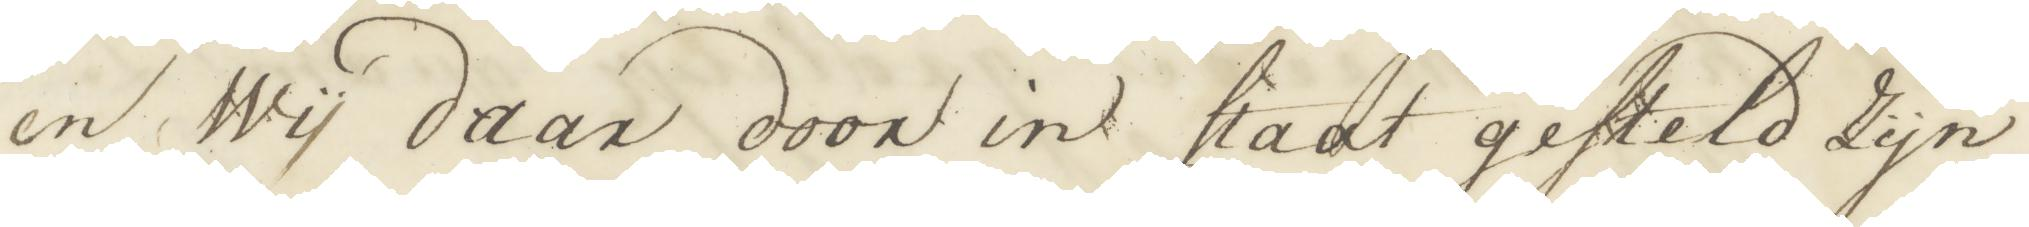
en wij daar door in staat gesteld zijn
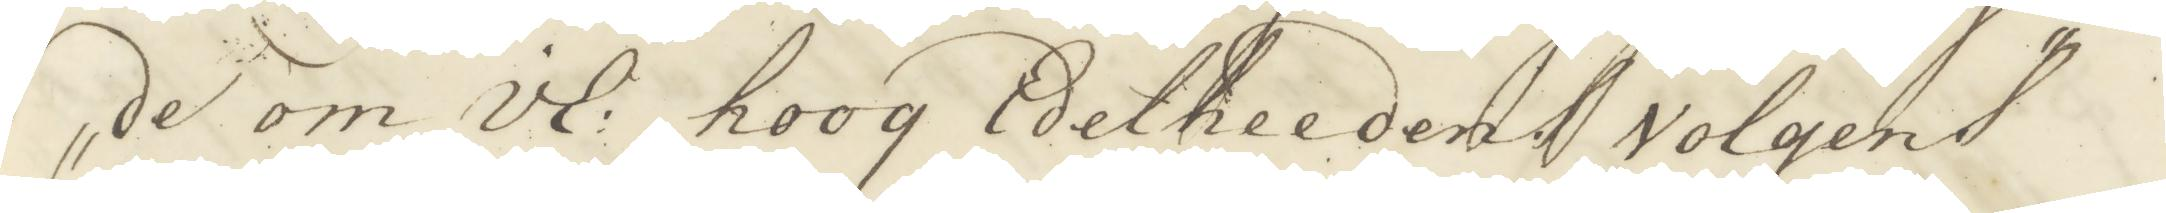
„de om UE: hoog Edelheedens volgens
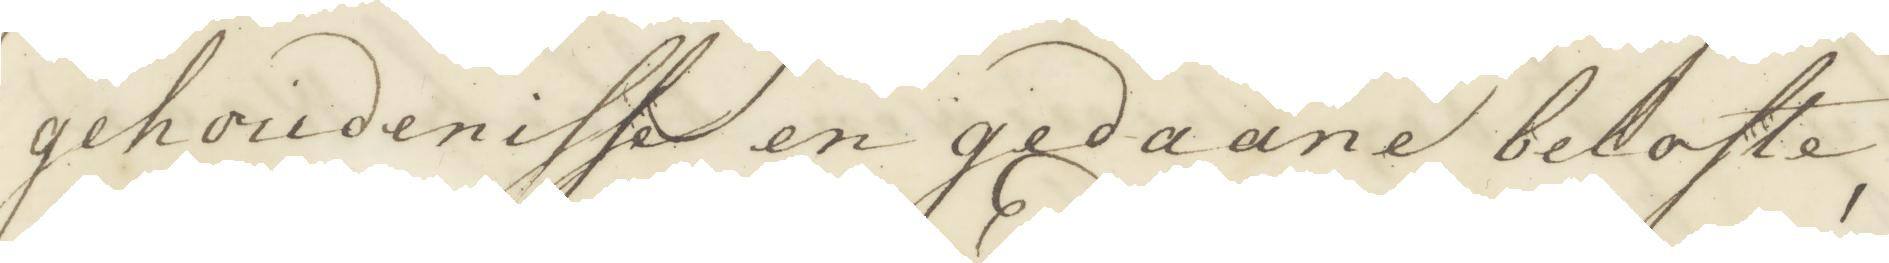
gehoudenisse en gedaane belofte,
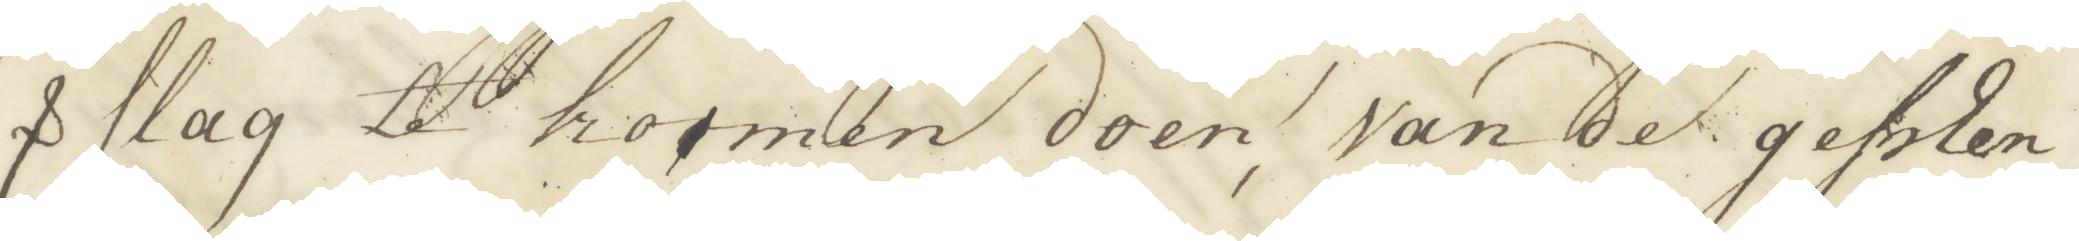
verslag te koomen doen, van de geschen
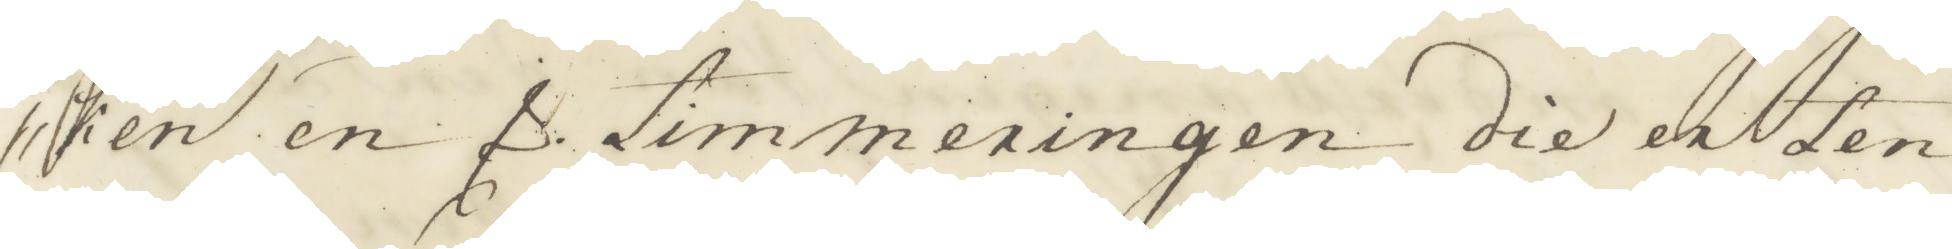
„ken en ver. timmeringen die er ten
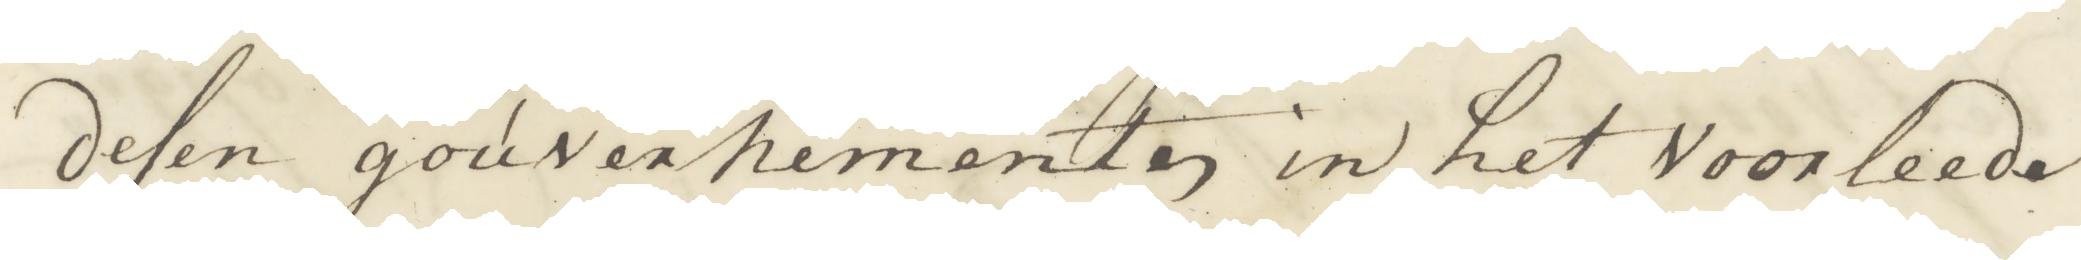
desen gouvernementen in het voorleede
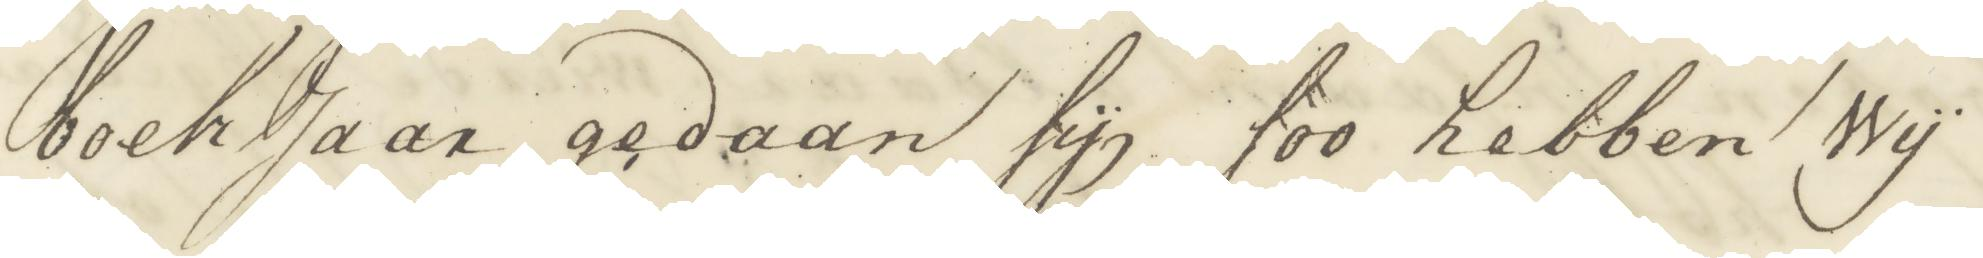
boek Jaar gedaan sijn, soo hebben wij
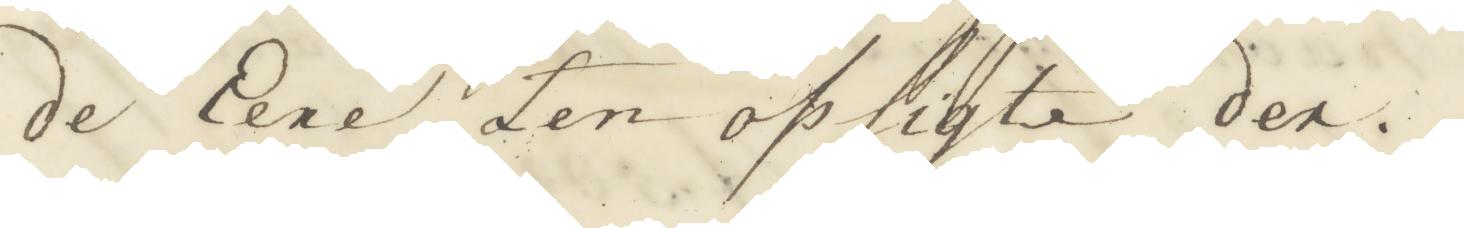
de Eere ten opsigte der.
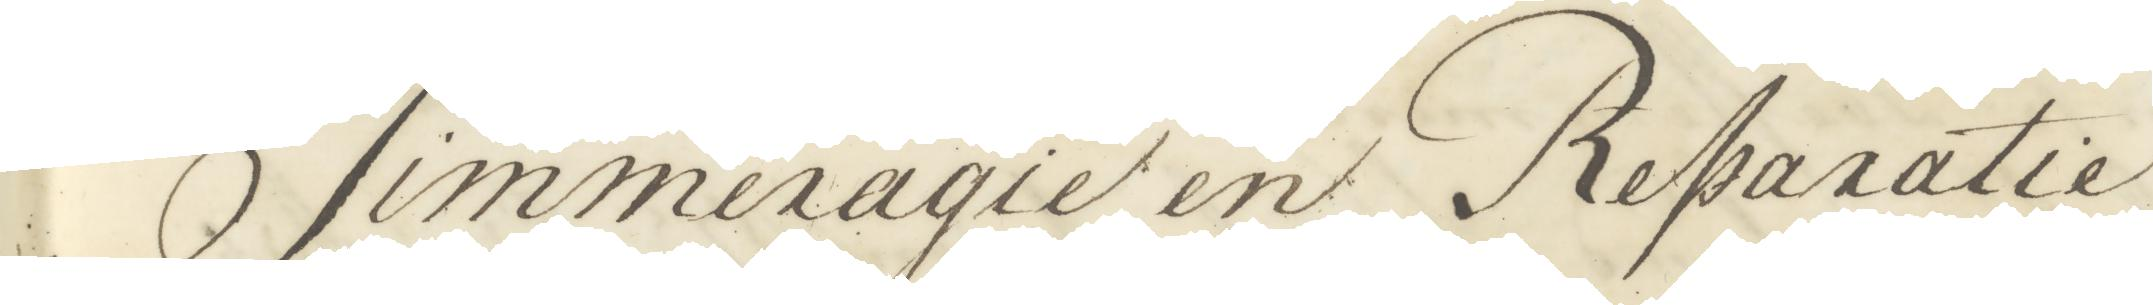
Timmeragie en Reparatie,
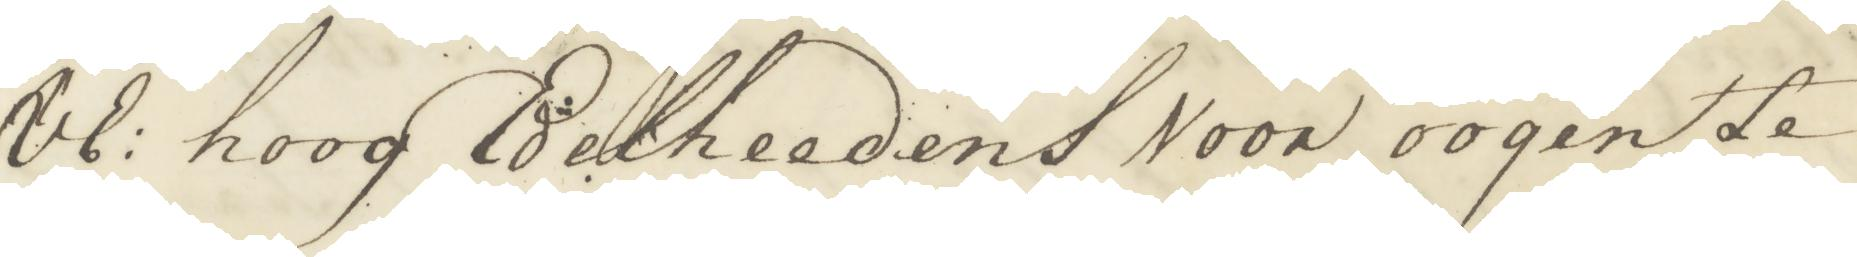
UE: hoog Edelheedens voor oogen te
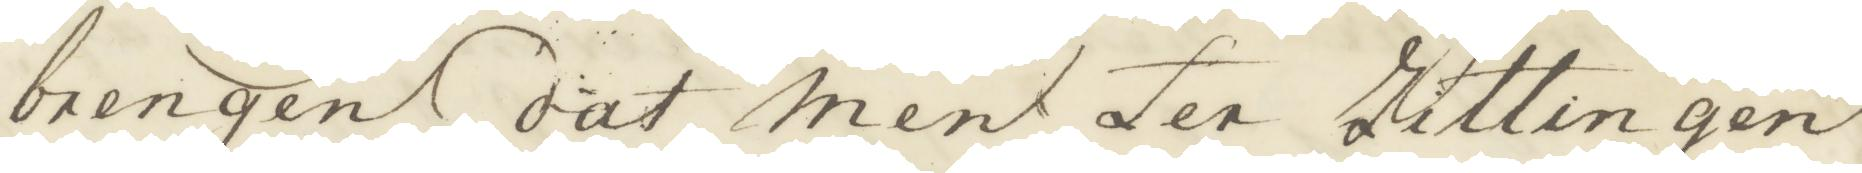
brengen, dat men ter zittingen
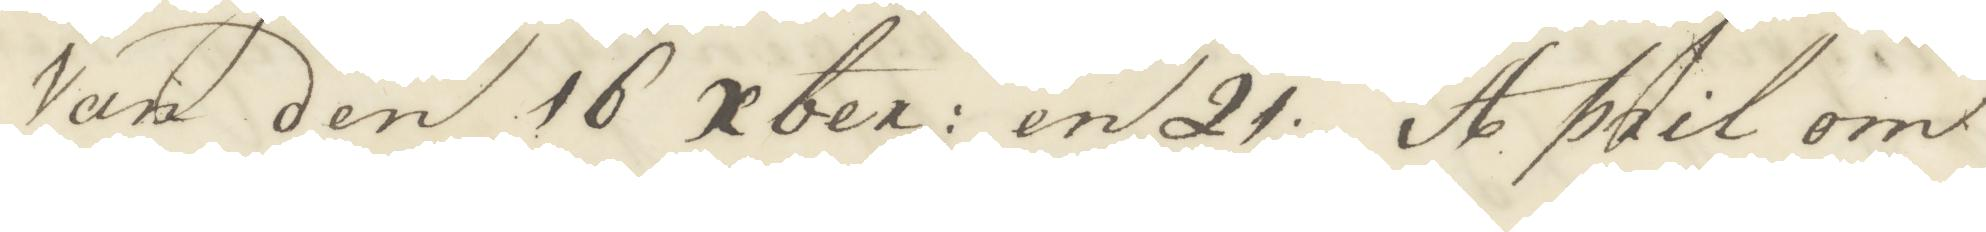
Van den 16 xber: en 21. April om
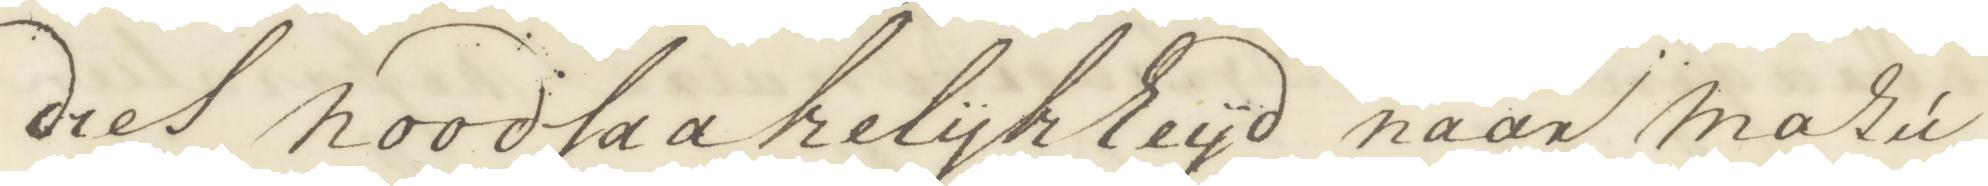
dies noodsaakelijkheijd naar mazu
